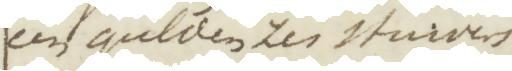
een gulden zes stuivers
